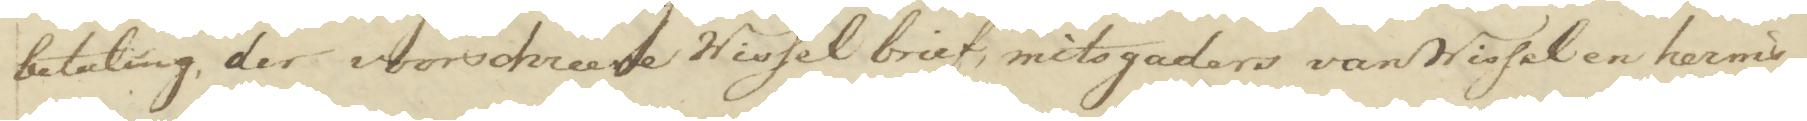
betaling, der voorschreeve Wissel brief, mitsgaders van Wissel en herwis
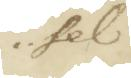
„sel
